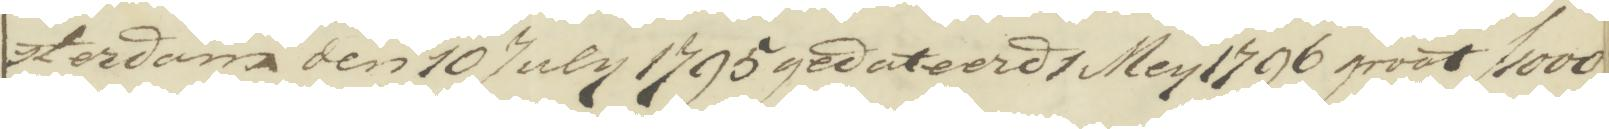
sterdam den 10 July 1795 gedateerd 1 Mey 1796 groot ƒ 1000
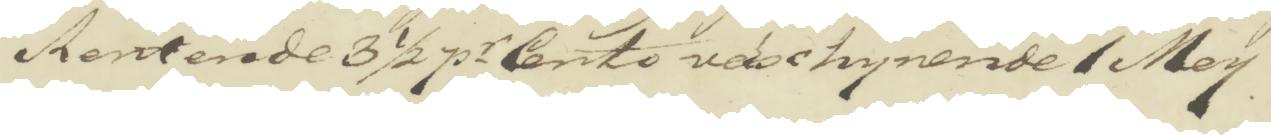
Rentende 3½ p-r Cento verschynende 1 Mey
